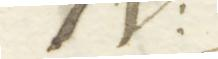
71:
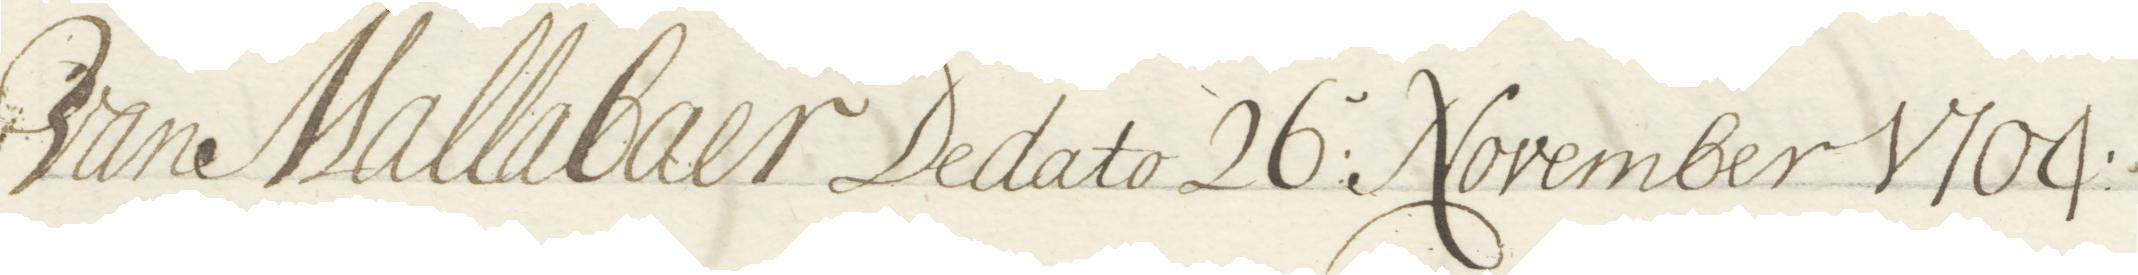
Van Mallabaer De dato 26:' November 1704:
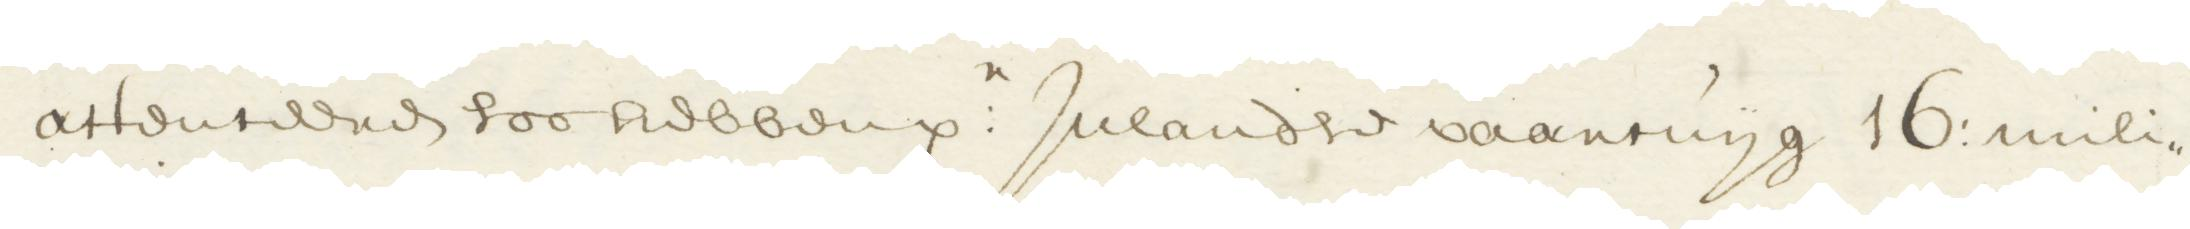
attenteeren soo hebben p:r Jnlandse vaartuijg 16: mili„
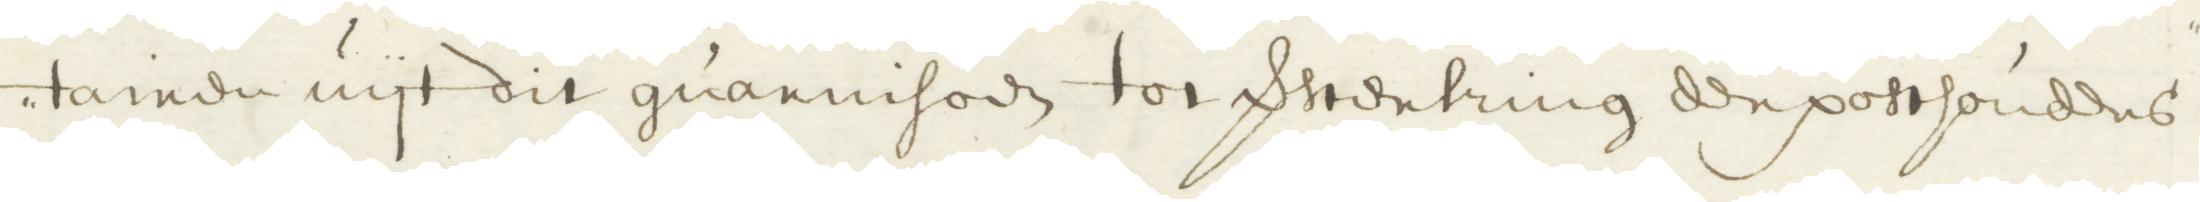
„tairen uijt dit guarnisoen tot versterking der posthouders
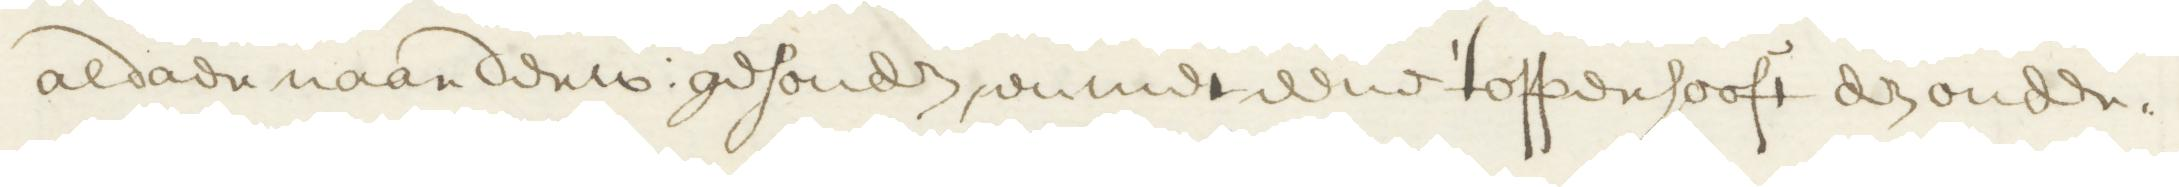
aldaer naar derw:ts gesonden, en met eene 't opperhooft den onder„
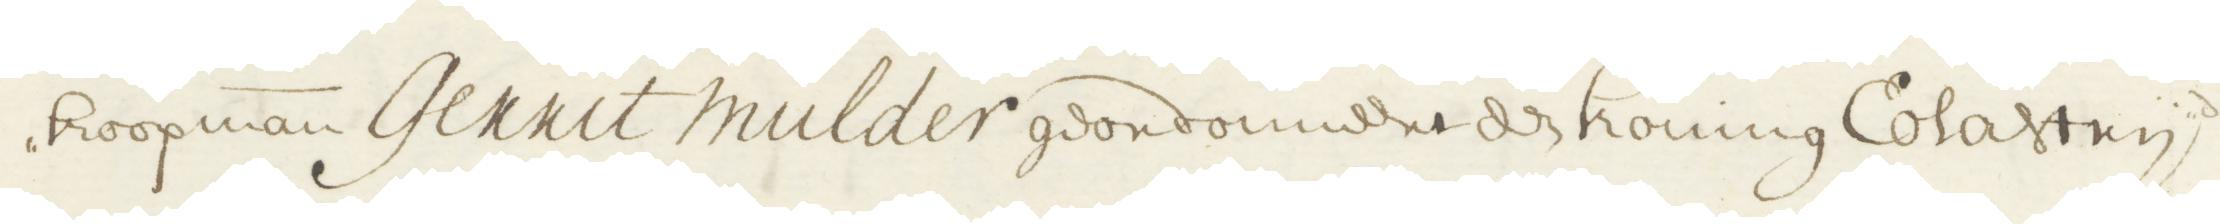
„koopman Gerrit Mulder geordonneert den koning Colastrij
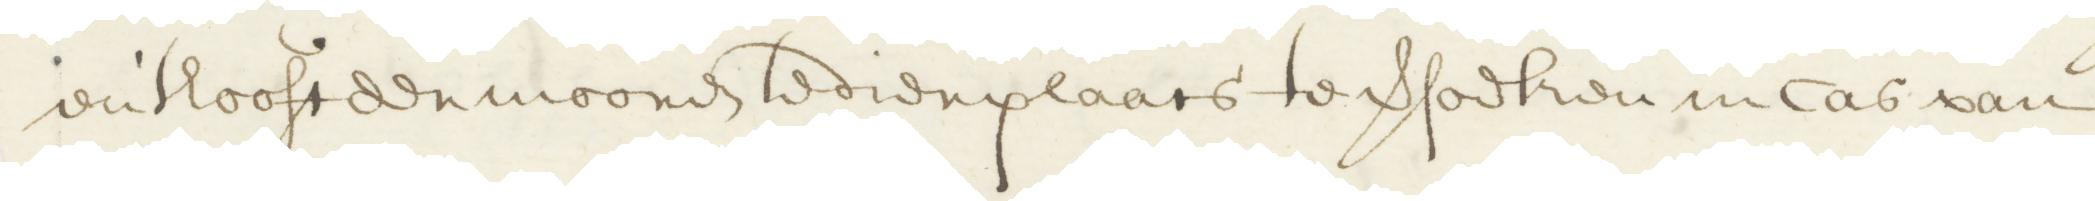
en 't hooft den mooren te dier plaats te versoeken in cas van
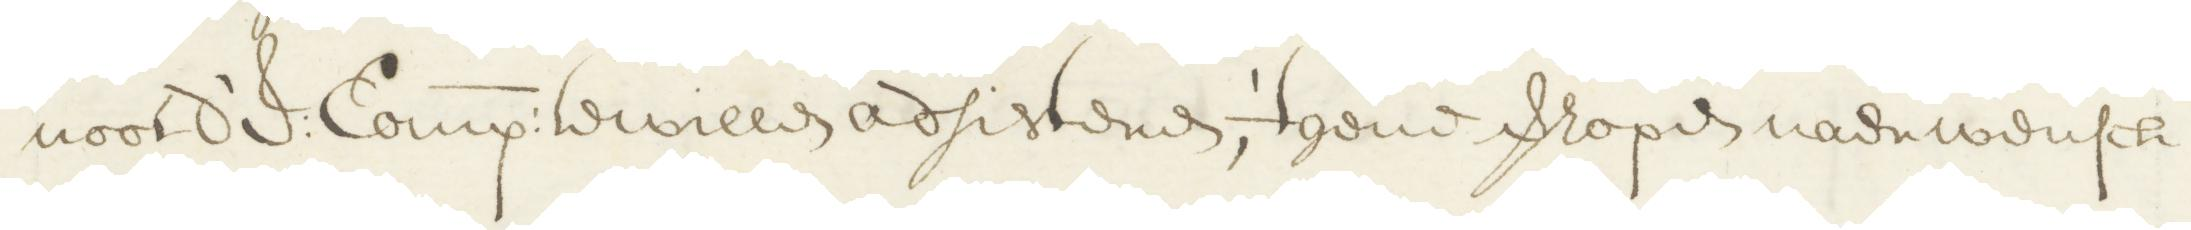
noot d’E: Comp: te willen adsisteren, 'tgene verhopen naer wensch
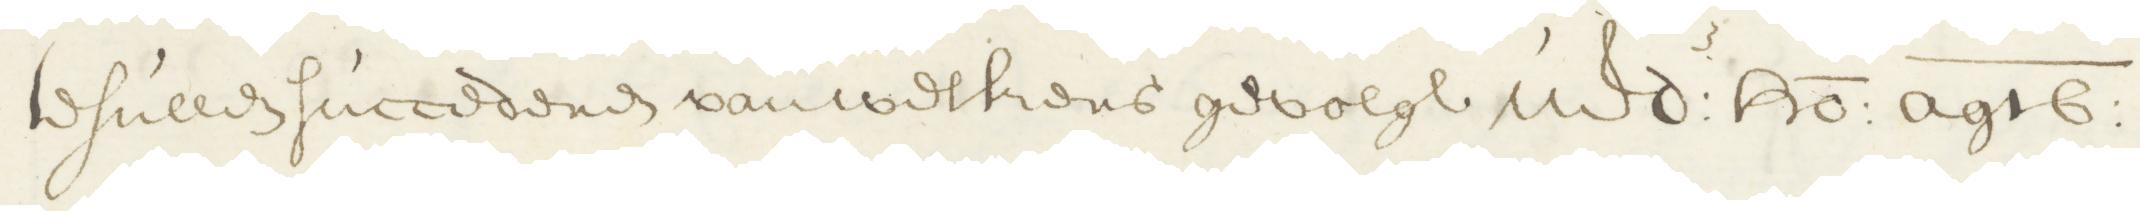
te sullen succederen van welkens gevolgh uEd:e Ho: agtb:
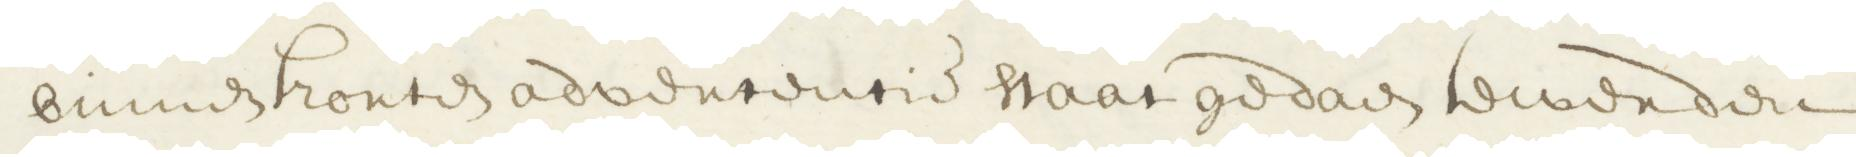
binnen korten advertentie staat gedaen te werden
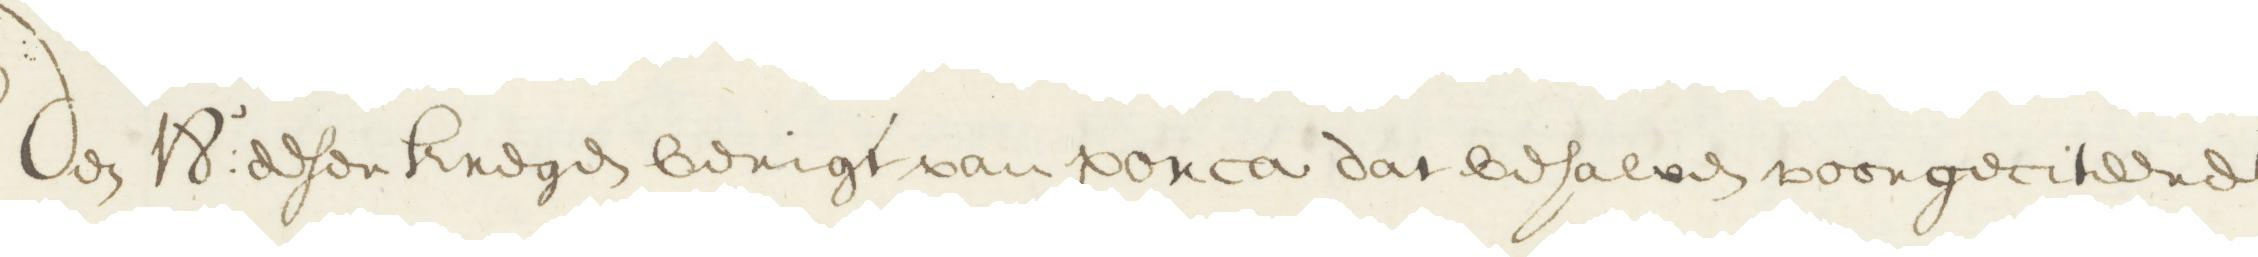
den 18:' desen kregen berigt van porca dat behalven voor geciteerd
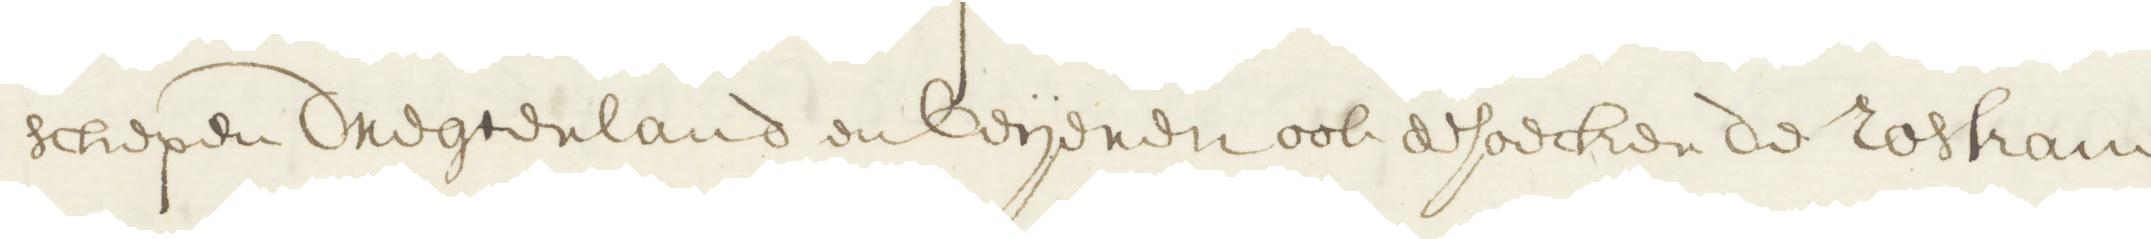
schepen dregterland en beijeren ook de hoecker de roskam
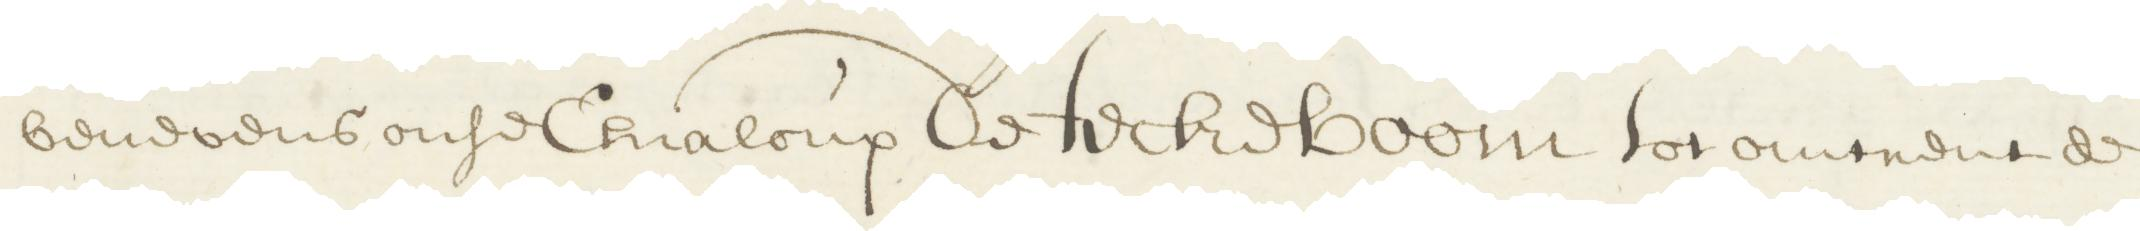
benevens onse Chialoup de teckeboom tot omtrent de
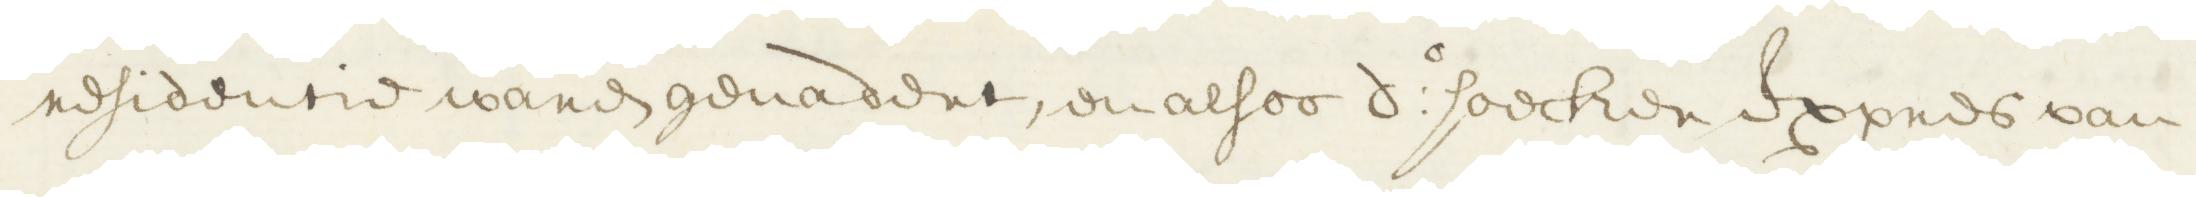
residentie waren genadert, en alsoo d:o hoecker Expres van
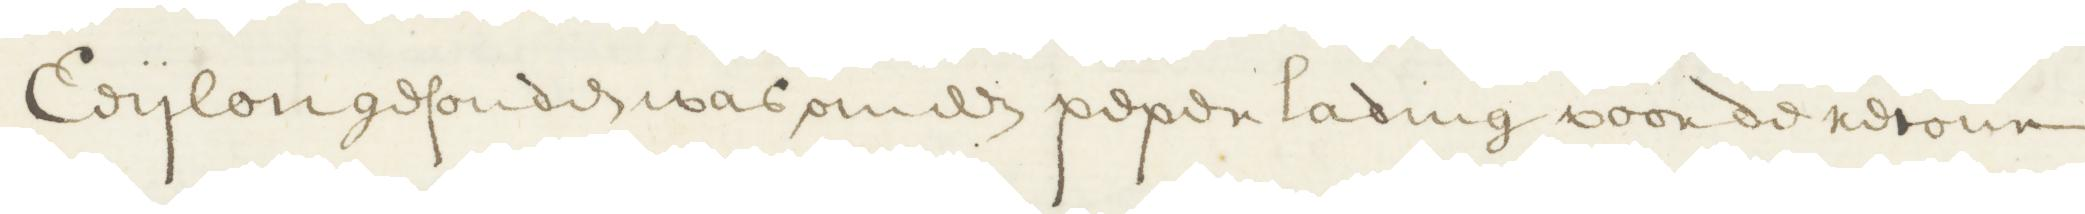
Ceijlon gesonden was om een peperlading voor de retour
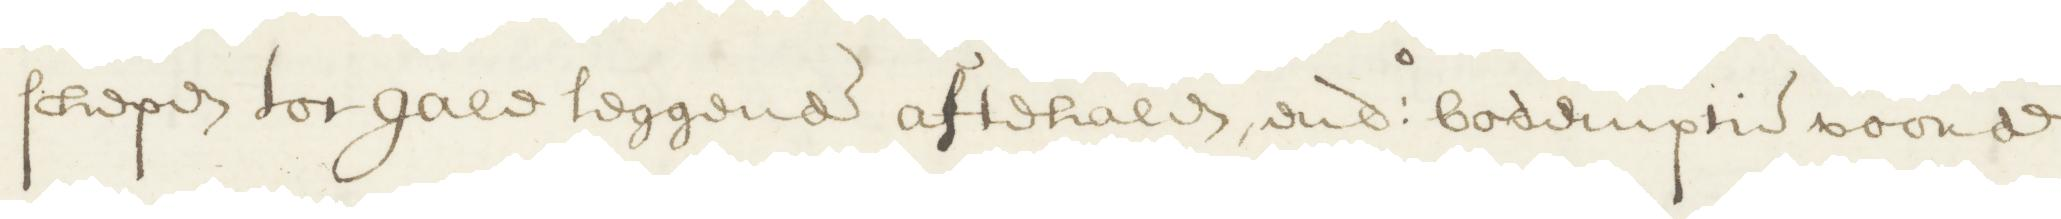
schepen tot gale leggende aftehalen, en d:o bodemptie voor de
